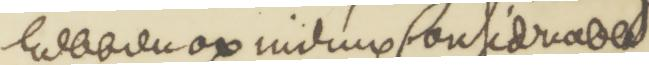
hebben op nieuw Considerable
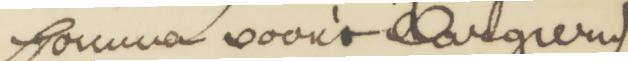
Somma voor't Bargern
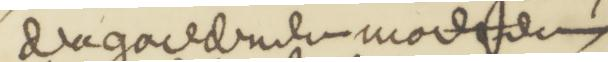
der goederen moeten
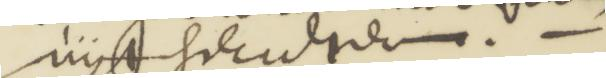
uijtschieten. —
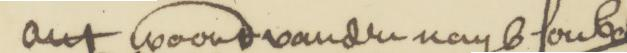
ant woord van den nayb souba
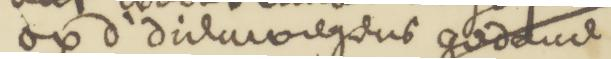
op d’ dier wegens gedane
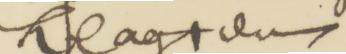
klagten
